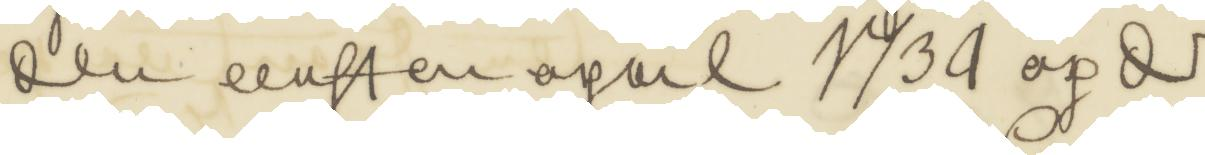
den eersten april 1734 op de
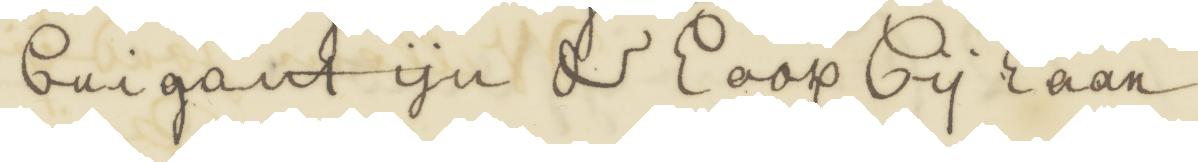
brigantijn de hoop bij haar
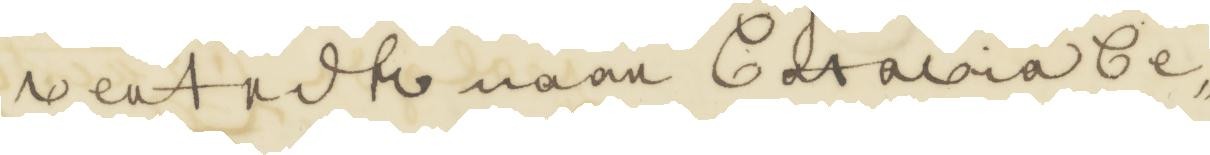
vertrek naar batavia be„
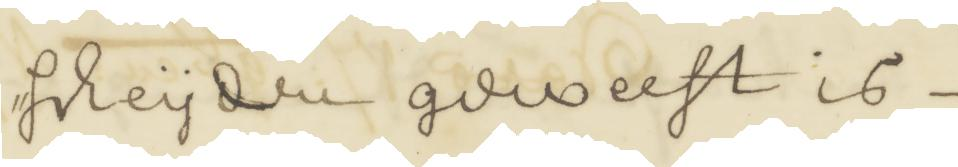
„scheijden geweest is —;
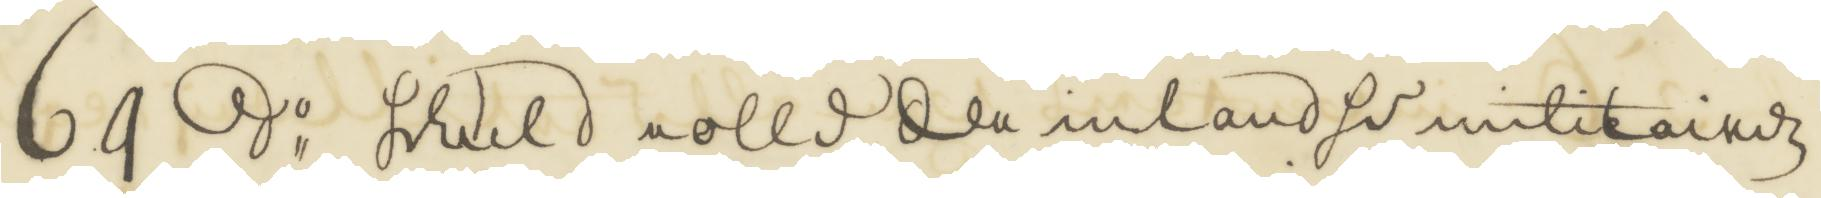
64 d„o Schuld rolle der inlandse militairen
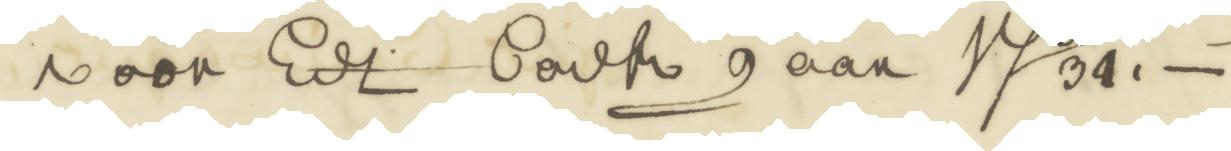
voor het boek jaar 1733/34.—
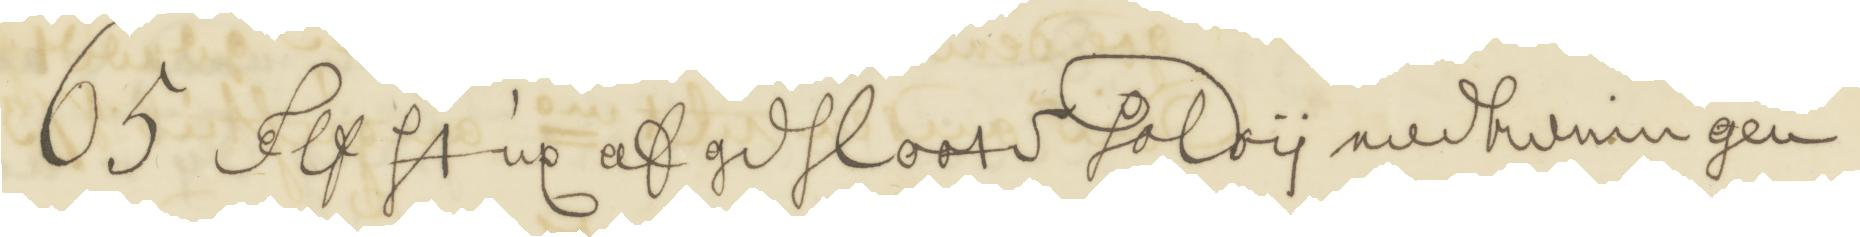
65 Elf stux af gesloote soldij reekeningen
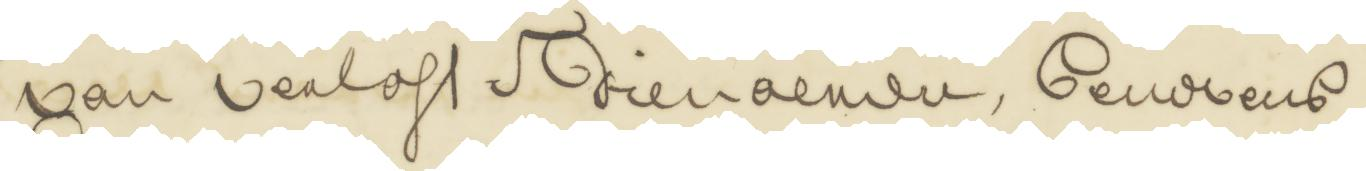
van verloste dienaeren, benevens
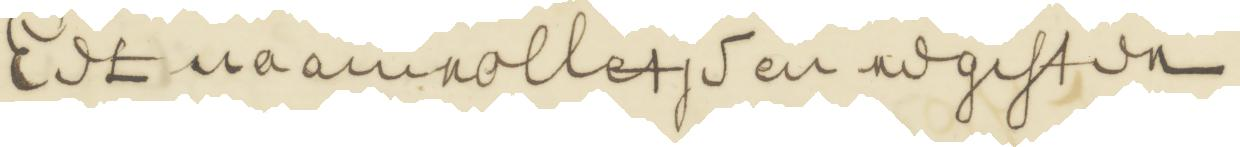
het naamrolletje en register
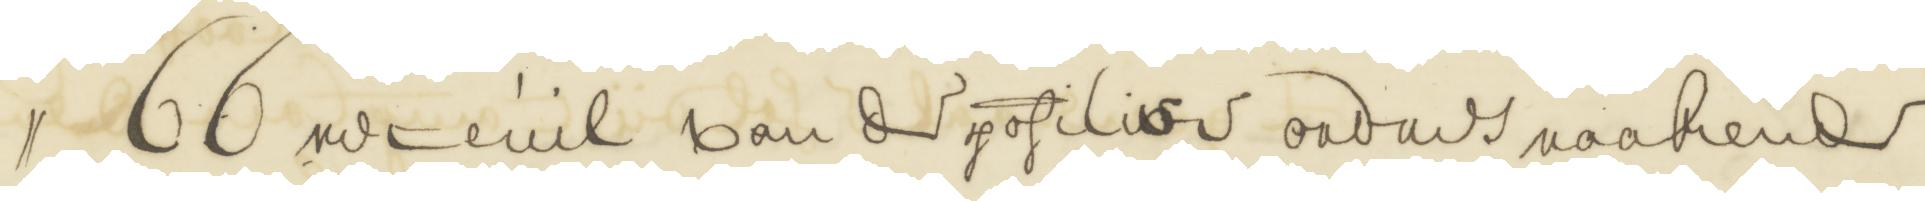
„ 66 receuil van de positive ordres raakende
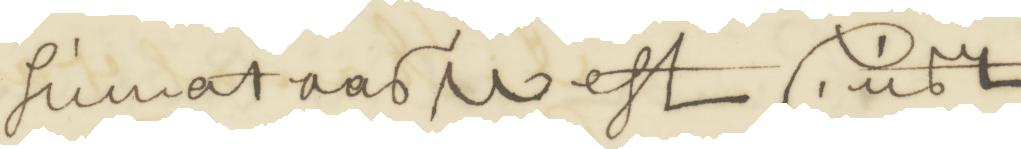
sumataas West Cust
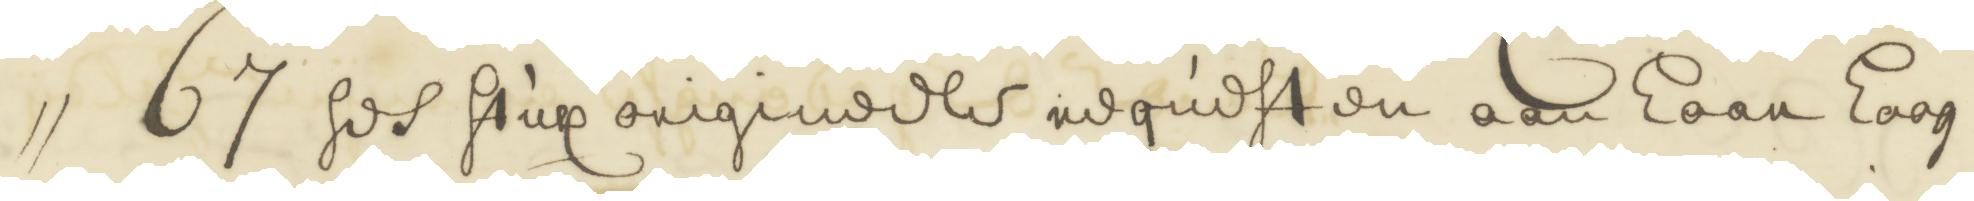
„ 67 ses stux origineele requesten aan haar hoog
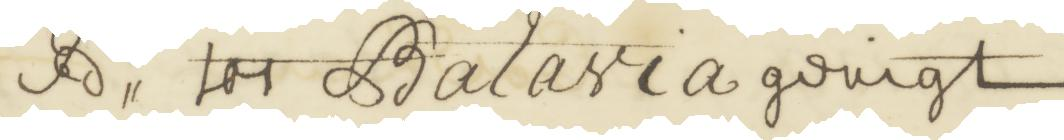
Ed„s tot Batavia gerigt;
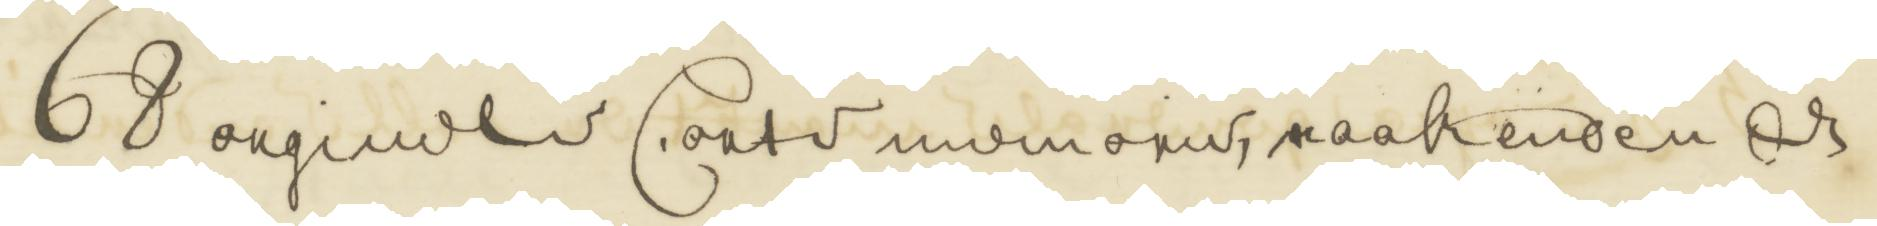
68 originele Corte memorie, raakenden den
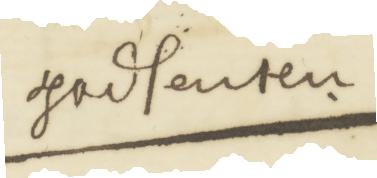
presenten
